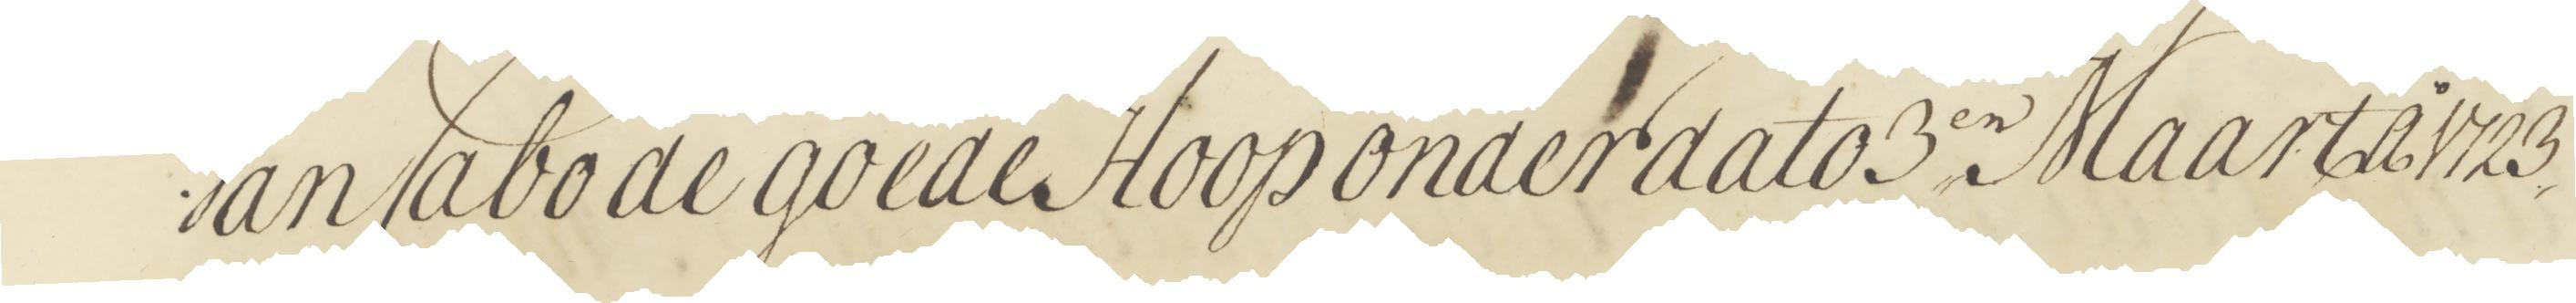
Van Cabo de goede Hoop onder dato 3„en Maart ao 1723,
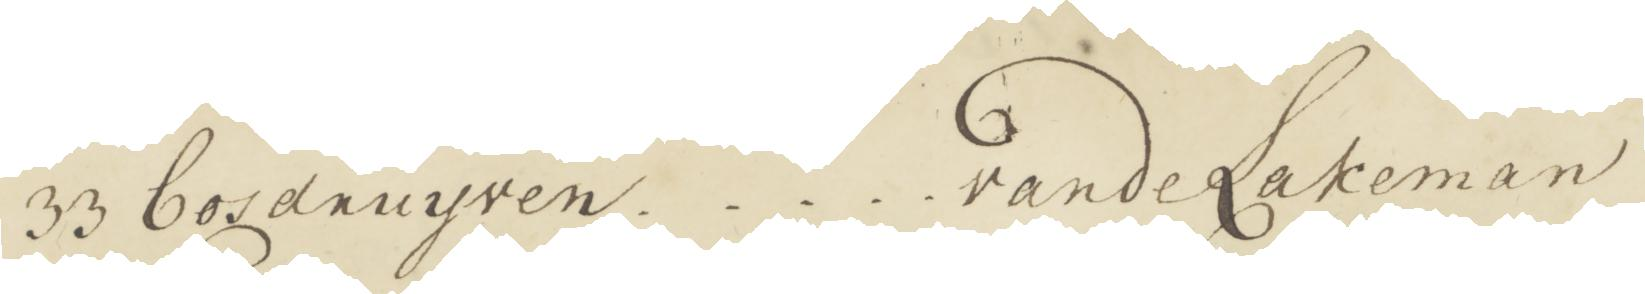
33 bosdruyven - - - - - van de Lakeman
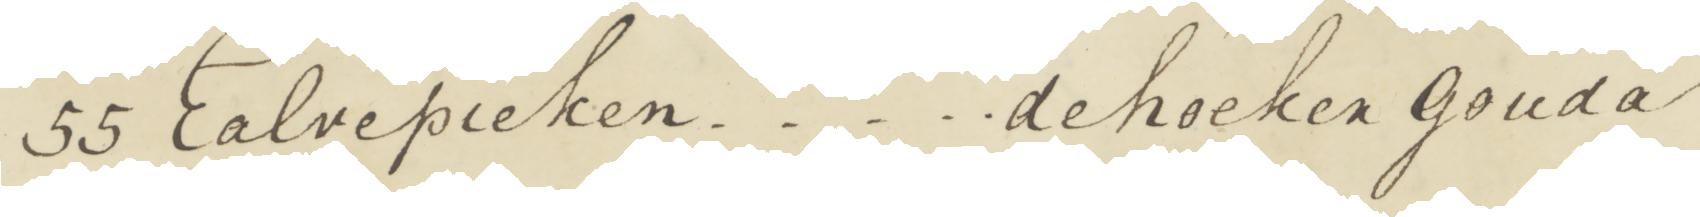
55 halvepieken - - - - - de hoeker gouda
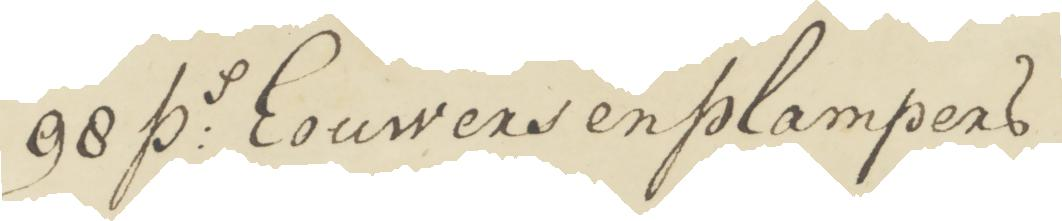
98 p:s houwers en plampers
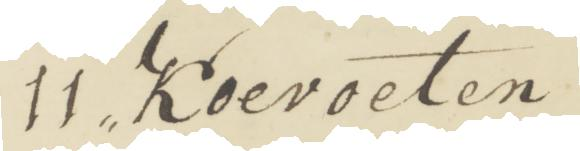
11 „ Koevoeten
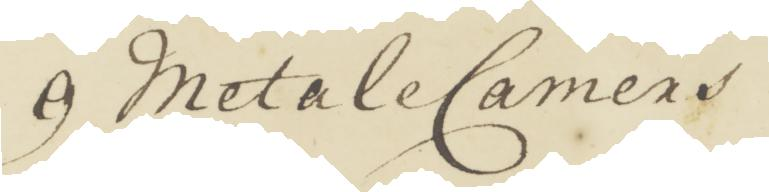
9 Metale Camers
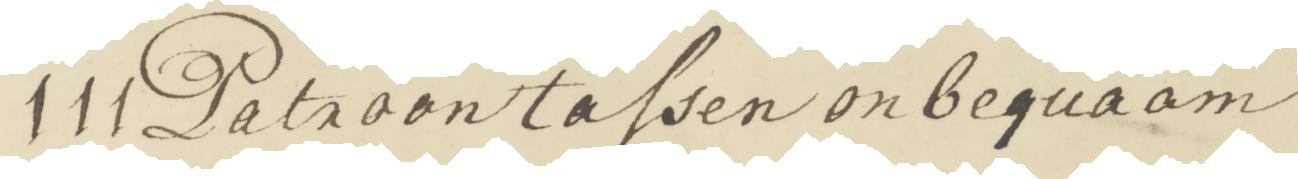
111 Patroon tassen onbequaam
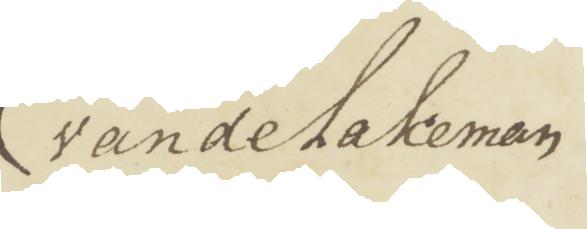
van de lakeman
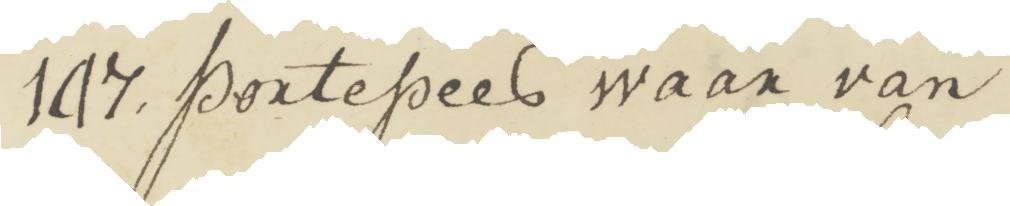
147. portepees waar van
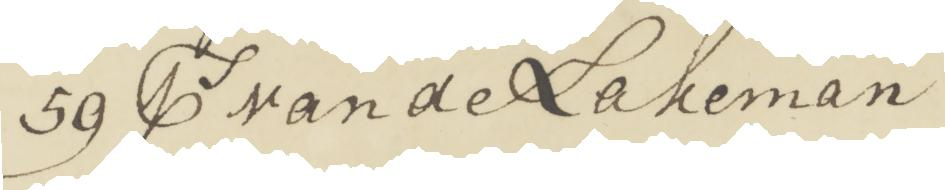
59 ps van de Lakeman
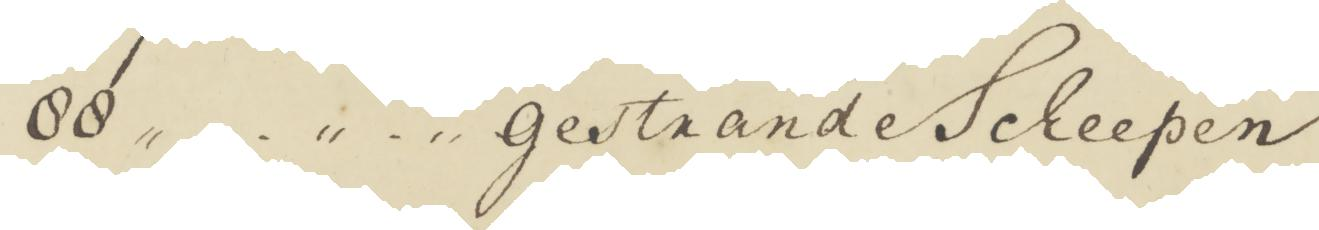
88 „ - - „ - „ gestrande scheepen
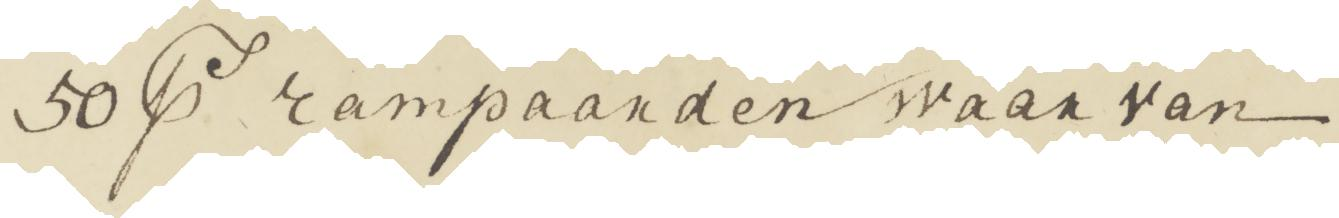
50 ps rampaarden waar van
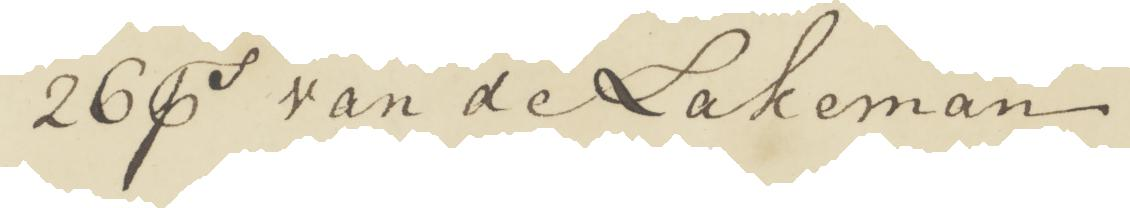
26 ps van de Lakeman
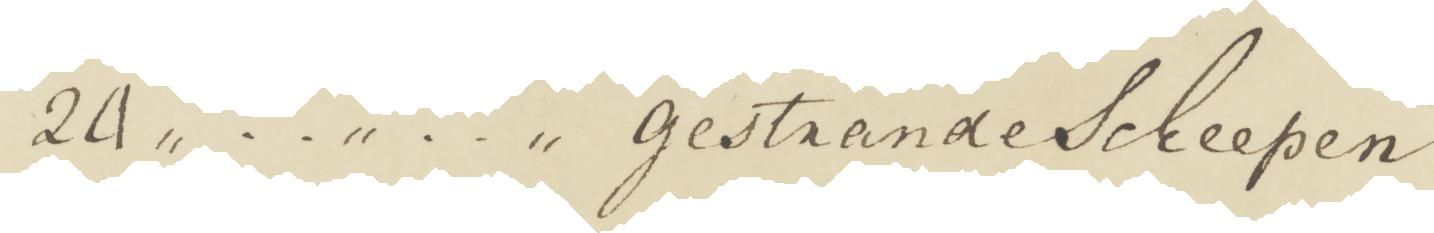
24 „ - - „ - - „ gestrande scheepen
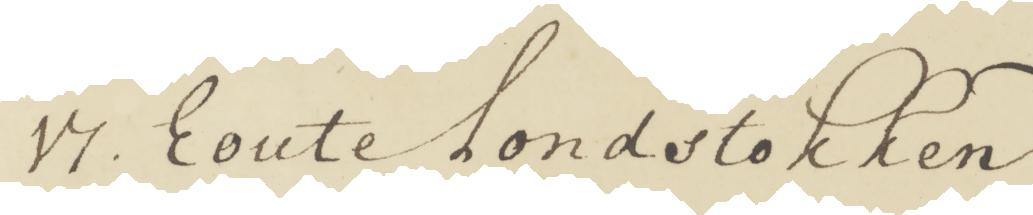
17. houte londstokken
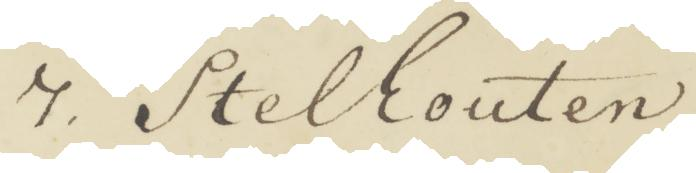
7. stelhouten
